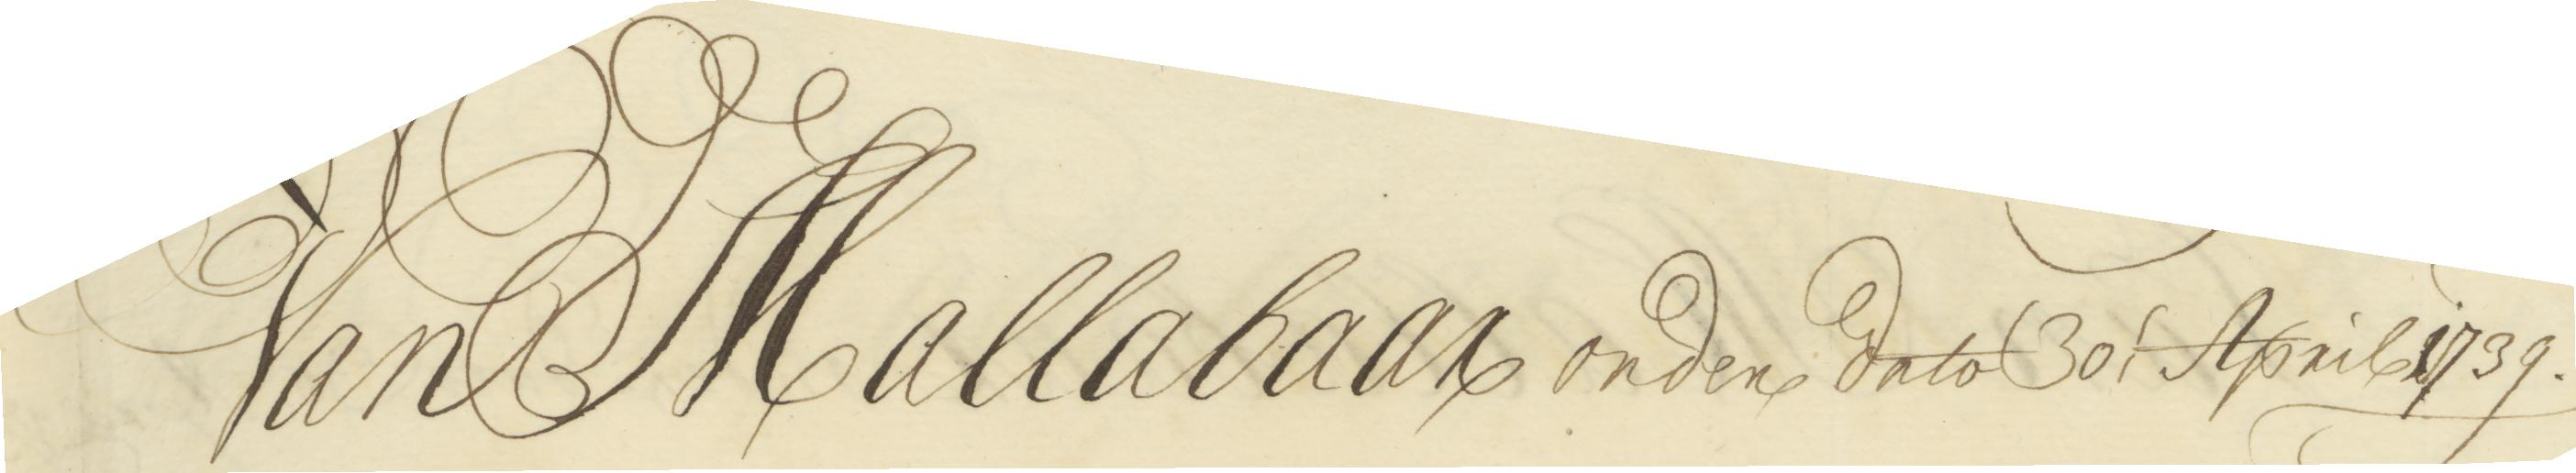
Van Mallabaar onder dato 30: April 1739.
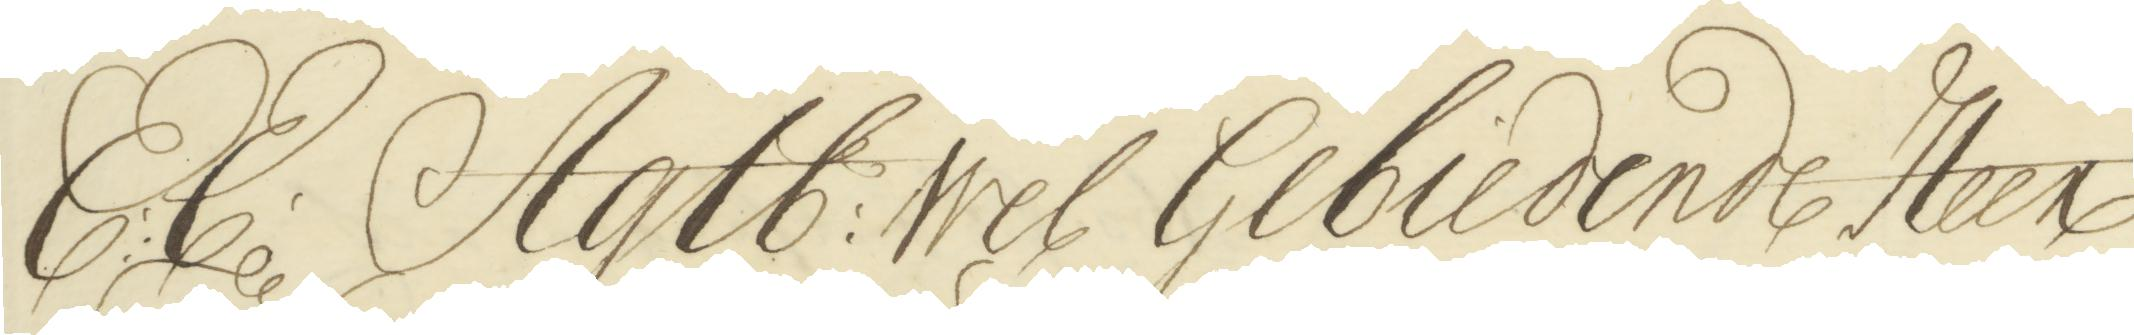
E: E: Agtb: wel Gebiedende Heer
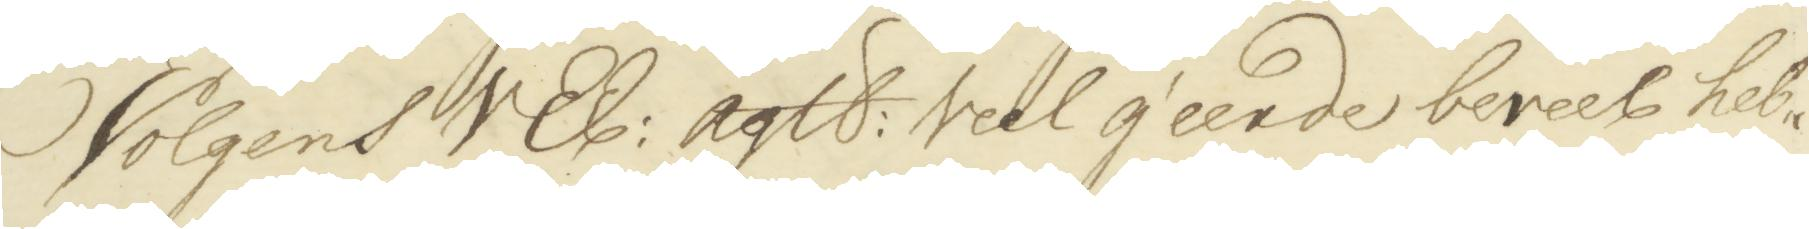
Volgens VEE: agtb: veel g’eerde beveel heb„
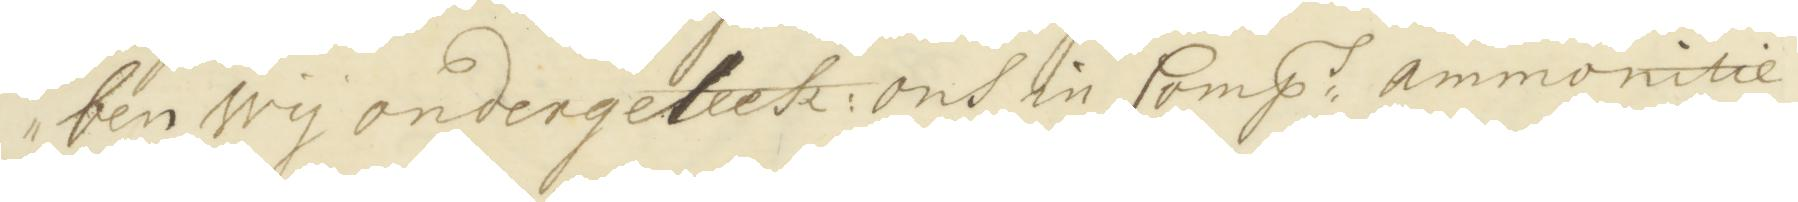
„ben wij ondergeteek: ons in Comp:s ammonitie
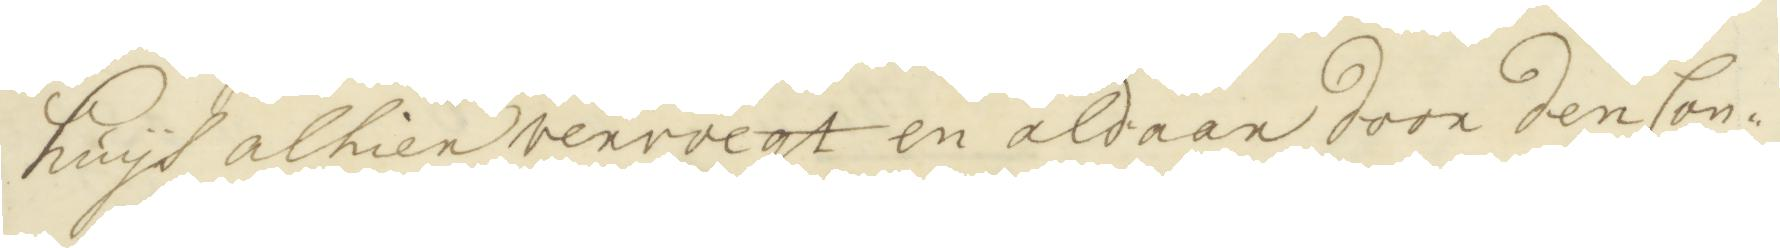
huijs alhier vervoegt en aldaar door den Con„
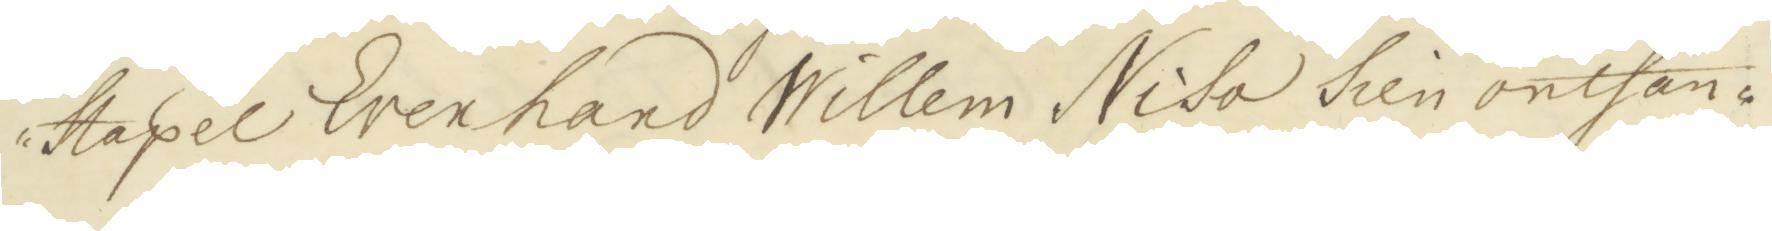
„stapel Everhard Willem Niso sien ontfan„
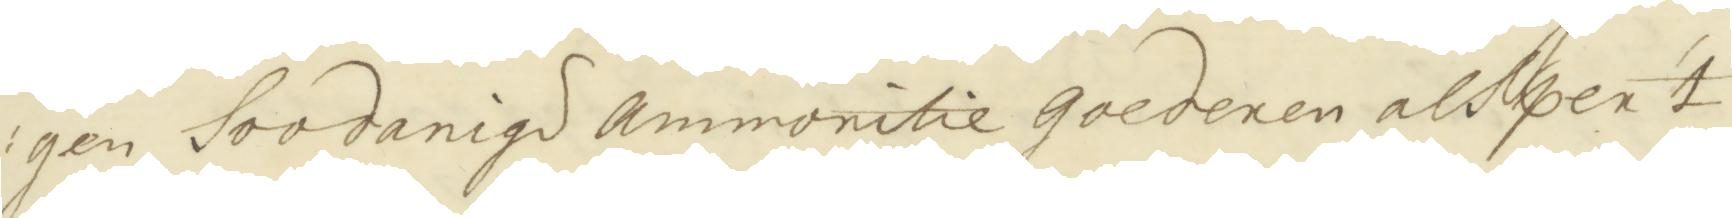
:gen soodanige Ammonitie goederen als per ’t
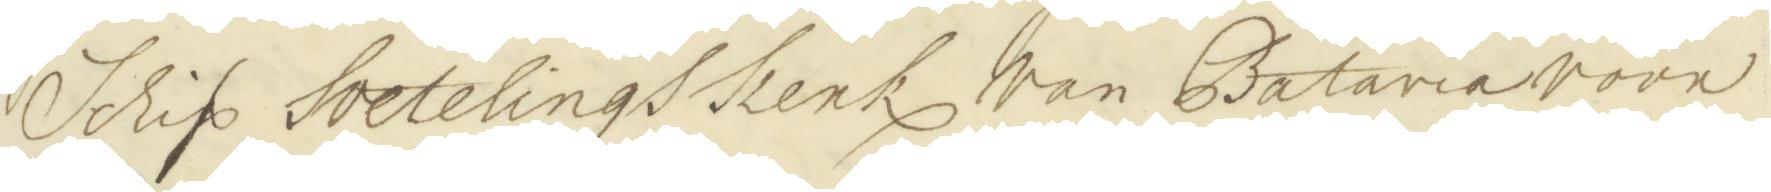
Schip soetelingskerk van Batavia voor
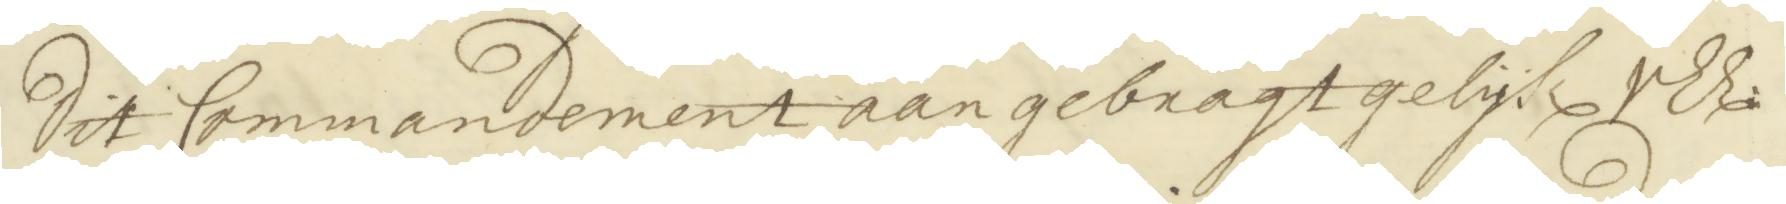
dit Commandement aan gebragt gelijk VEE:
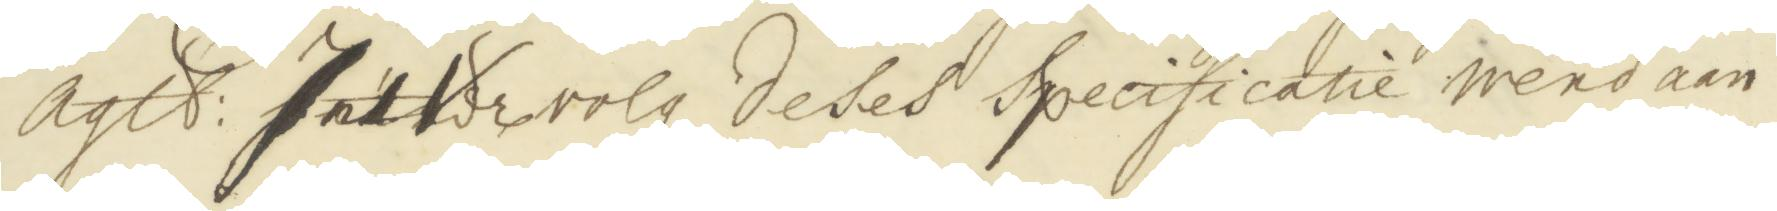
Agtb: Jn't vervolg deses specificatie werd aan
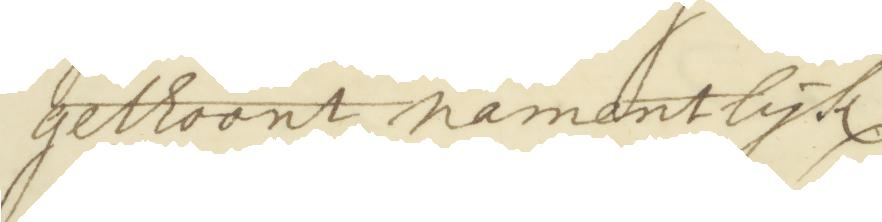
gethoont namentlijk
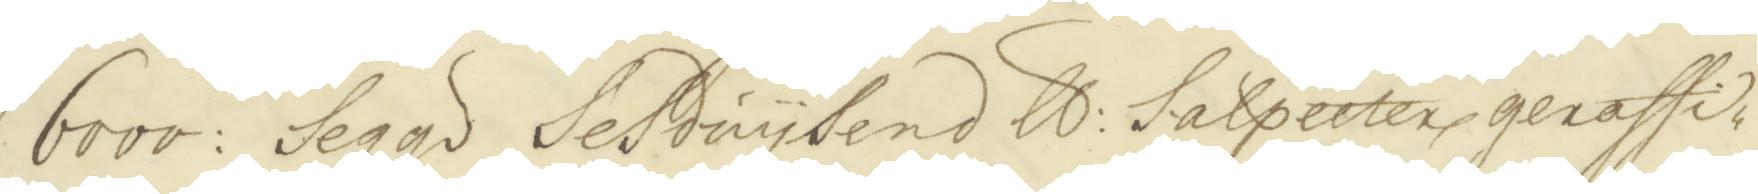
6000: segge sesduijsend lb: salpeeter geraffi„
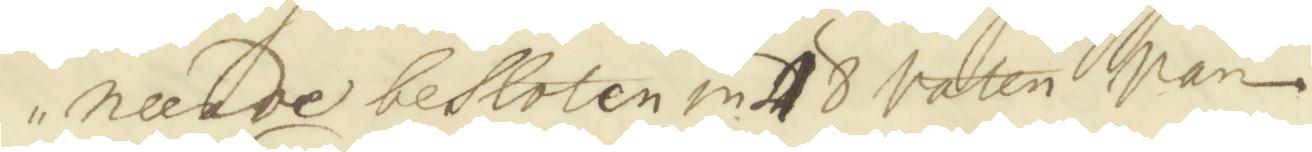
„neerde besloten in 48 vaten Van
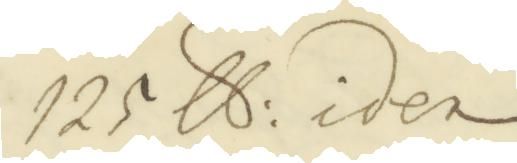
125 lb: ider
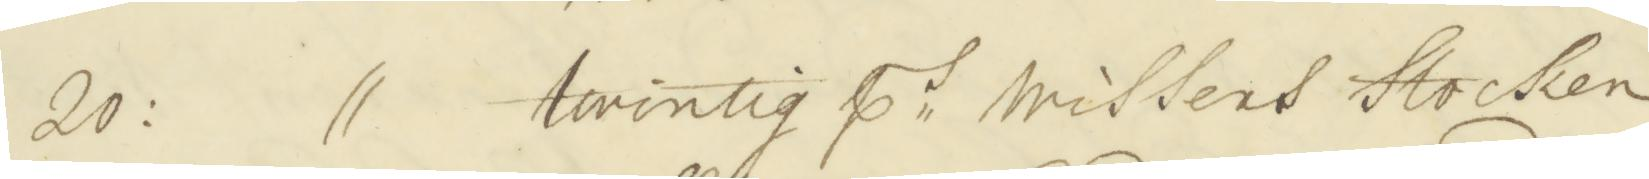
20: „ twintig p„s wissers stocken
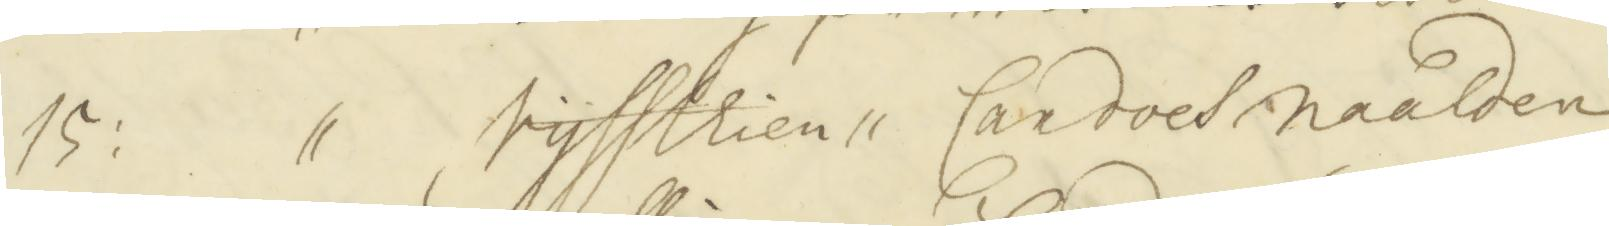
15: „ vijffthien„ Cardoes naalden
